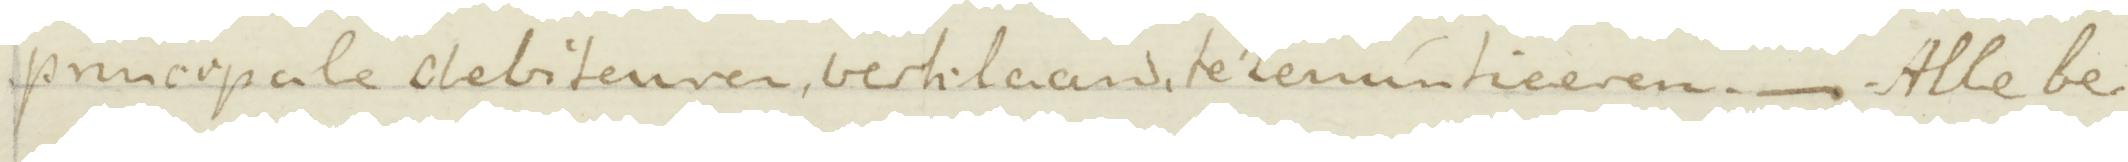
principale debiteuren, verklaard, te renuntieeren. — Alle be
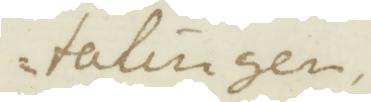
=talingen,
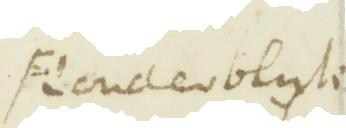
¶ zonder blyk
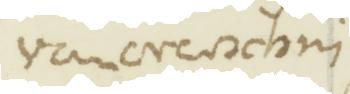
van overschrij
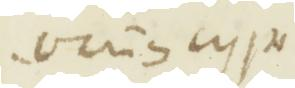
„ving cyfr
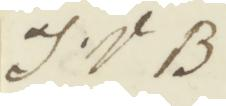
J.V B
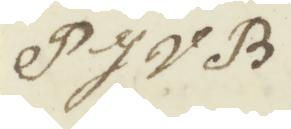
P J V B
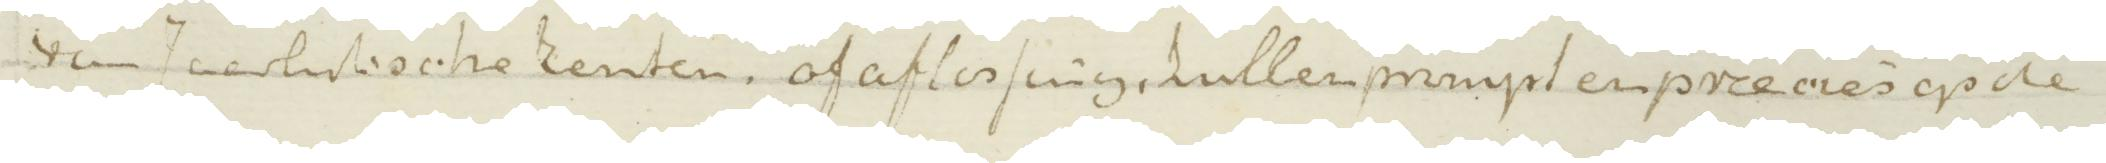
ven Jaarlyksche renten, of aflossing, zullen pompt en precies op de
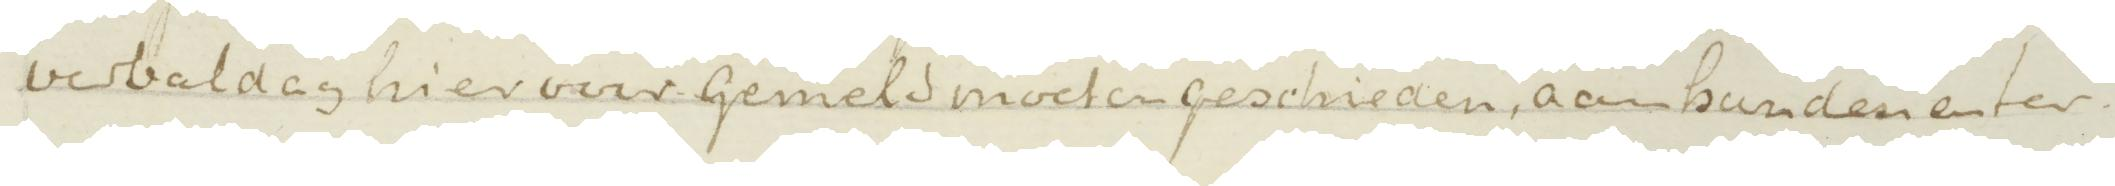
vervaldag hier voor gemeld moeten geschieden, aan handen en ter
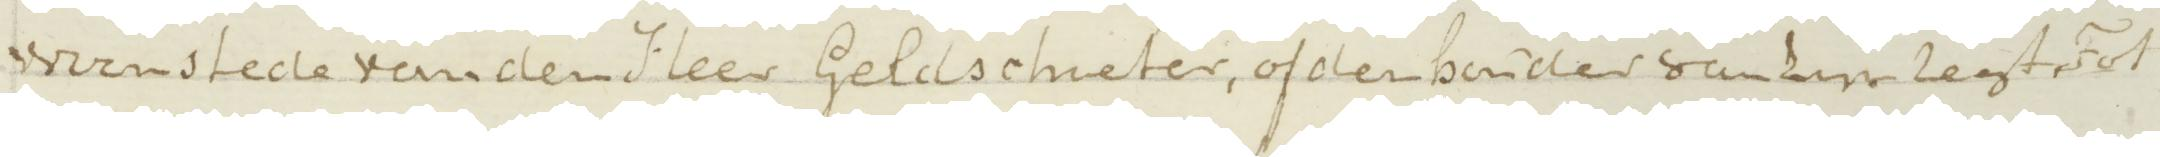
woonstede van den Heer Geldschieter, of den houder van zyn regt Tot
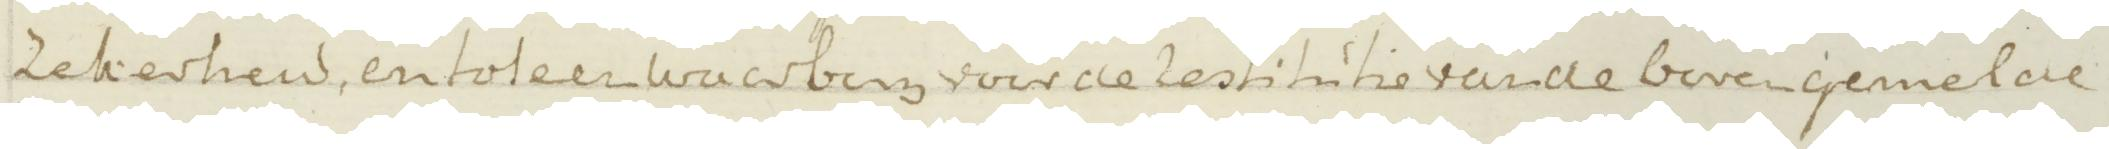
zekerheid, en tot een waarborg voor de restitutie van de bovengemelde
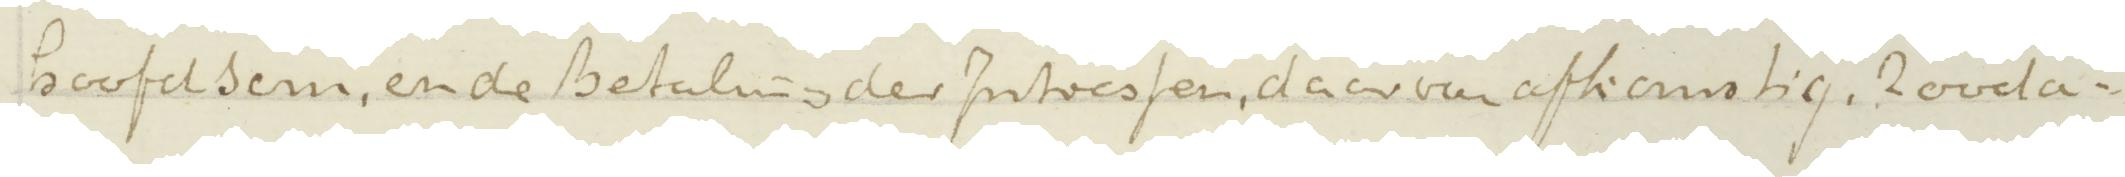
hoofdsom, en de Betaling der Jntressen, daar van afkomstig, Zooda-
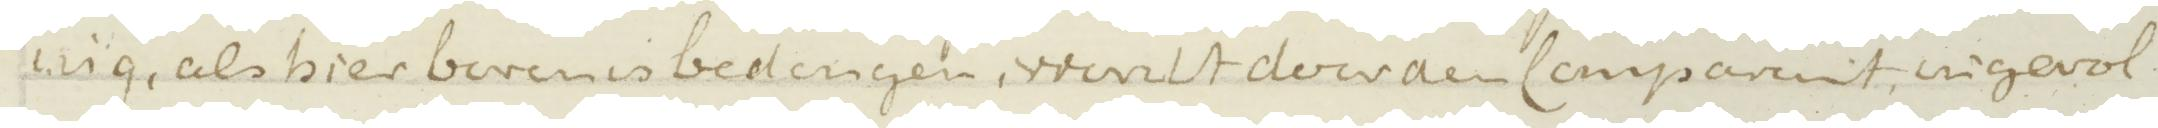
nig, als hier boven is bedongen, voort door den Comparant, ingevol
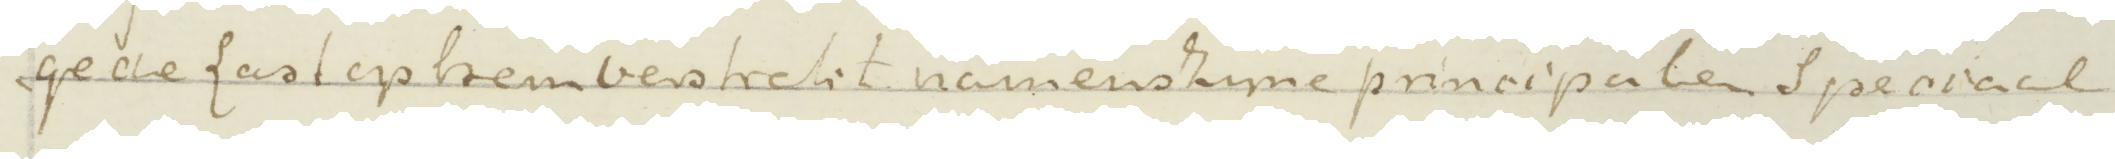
-ge de Last op hem verstrekt namens zyne principalen Speciaal
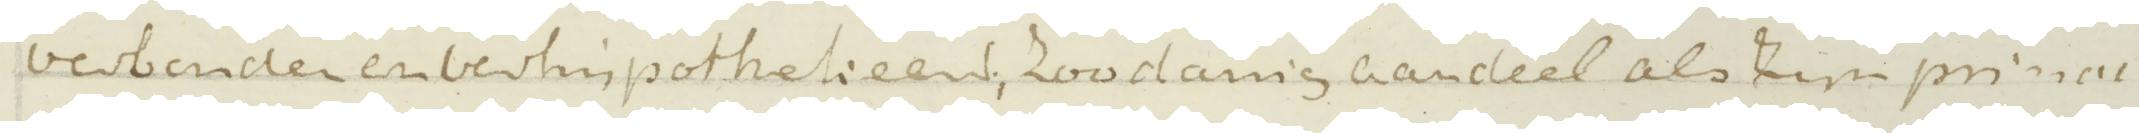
verbonden en verhijpothekeerd, zoodanig aandeel als zyn princi
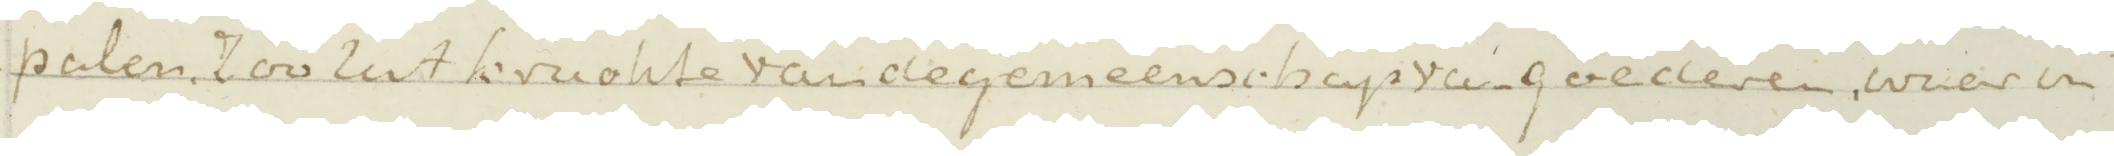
-palen, zoo uit krachte van de gemeenschap van goederen, waar in
